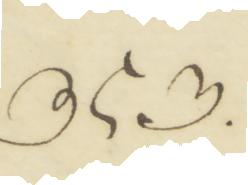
353.
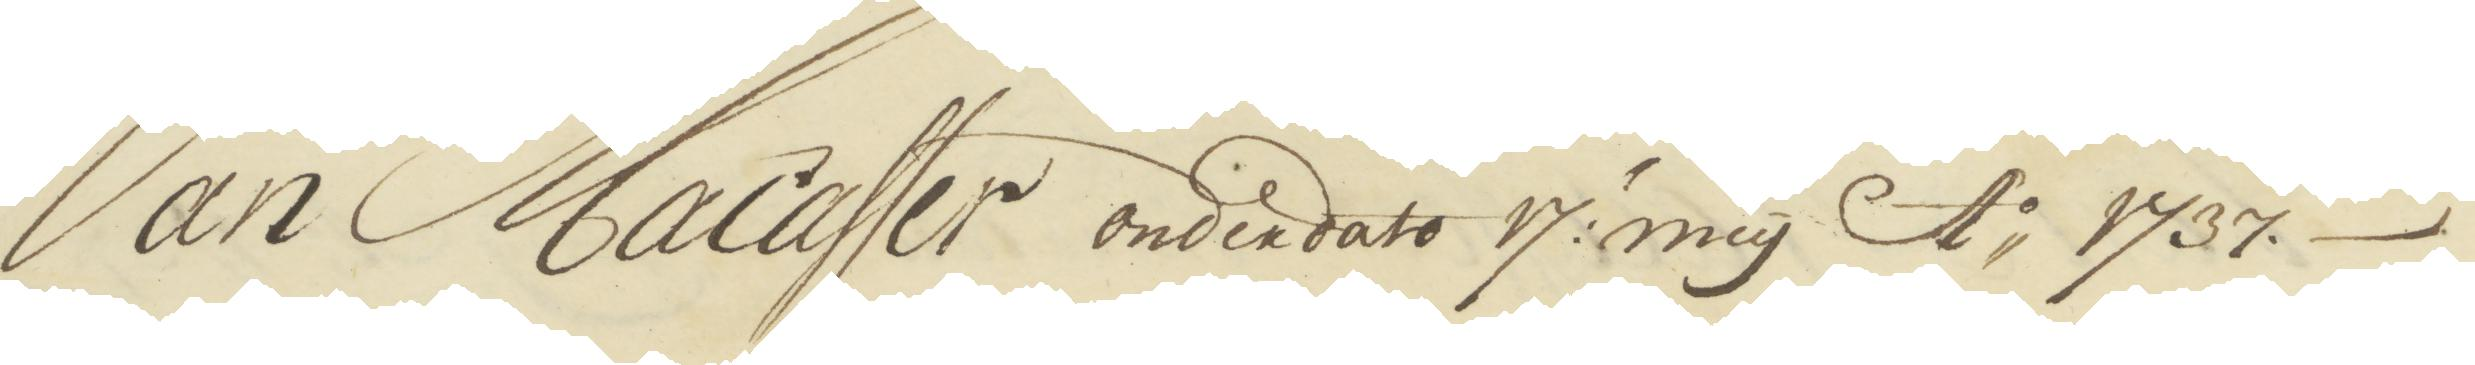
Van Macasser onder dato 17:' meij A„o 1737. —
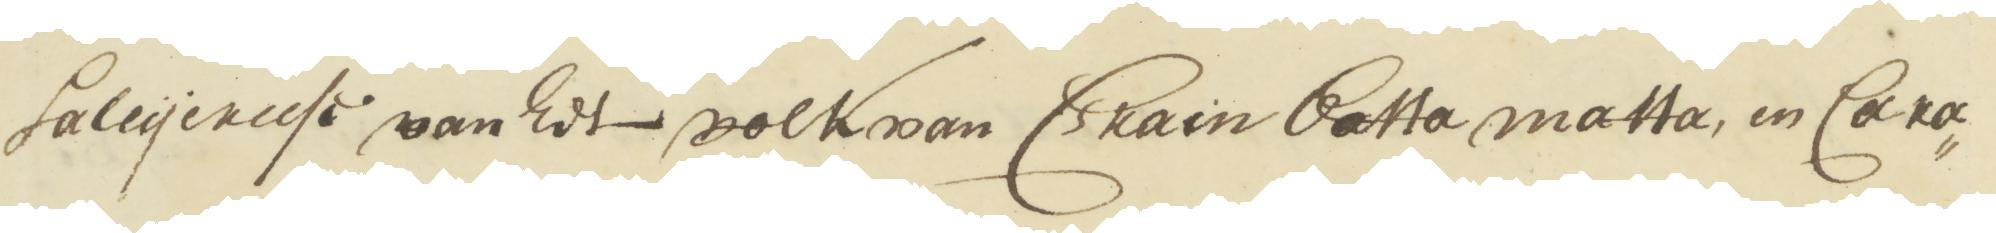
saleijereese van het volk van Crain batta matta, en Cara„
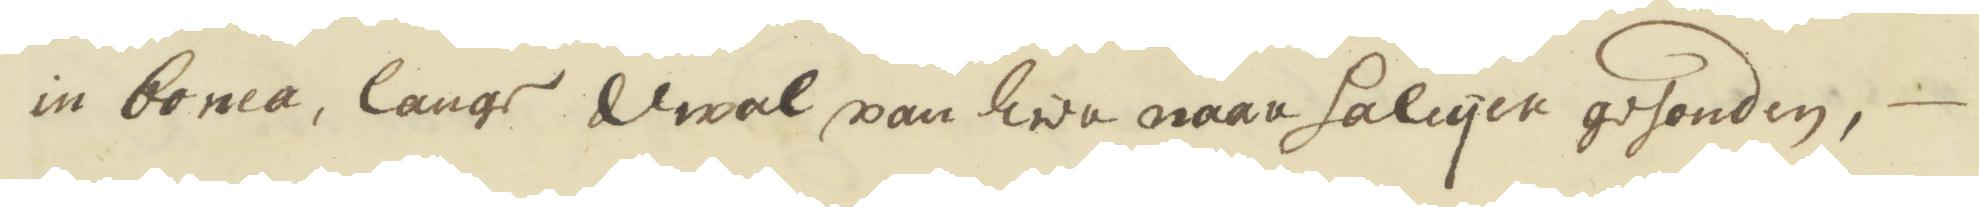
in bonea, langs dewal van hier naar saleijer gesonden, —
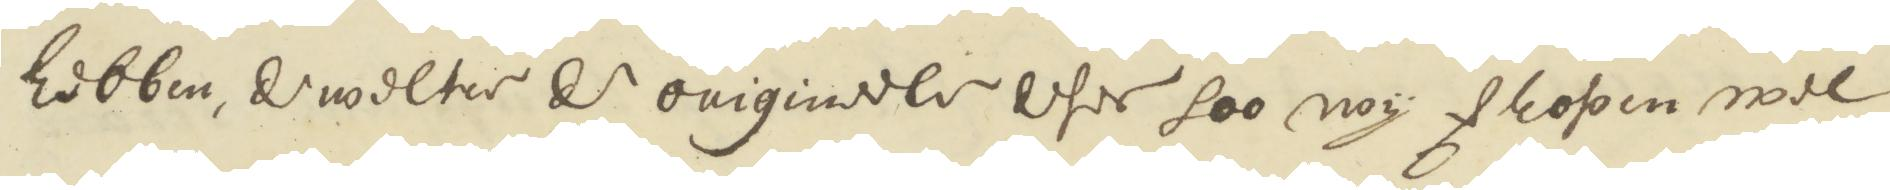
hebben, de welke de origineele deses soo wij verhopen wel
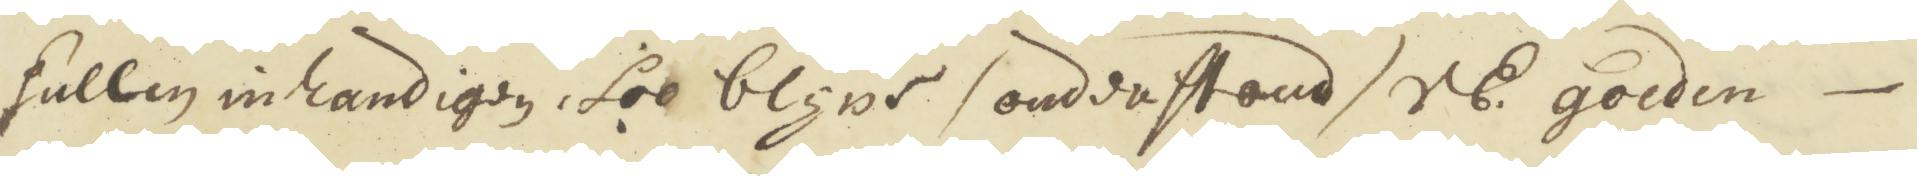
sullen inhandigen soo blijve /onderstond/ VE. goeden —
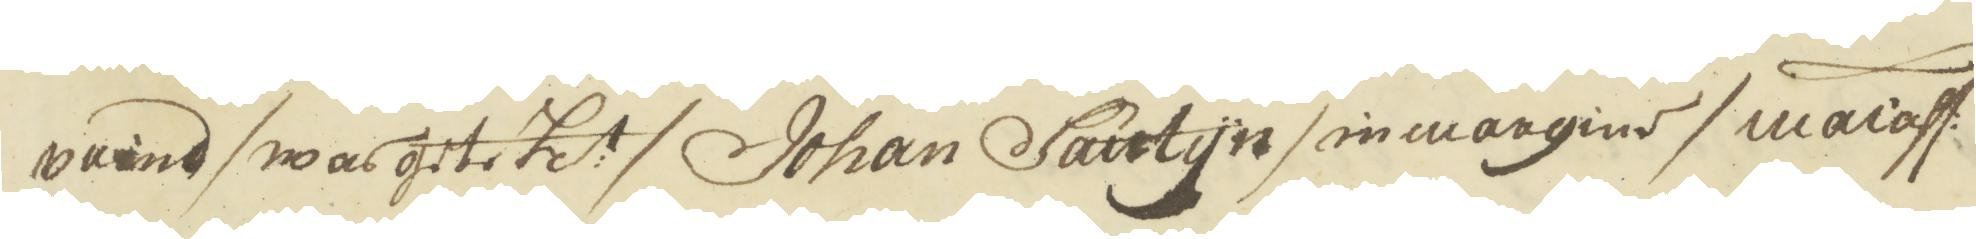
vrind /was getek:t/ Iohan sautijn /in margine/ macass:
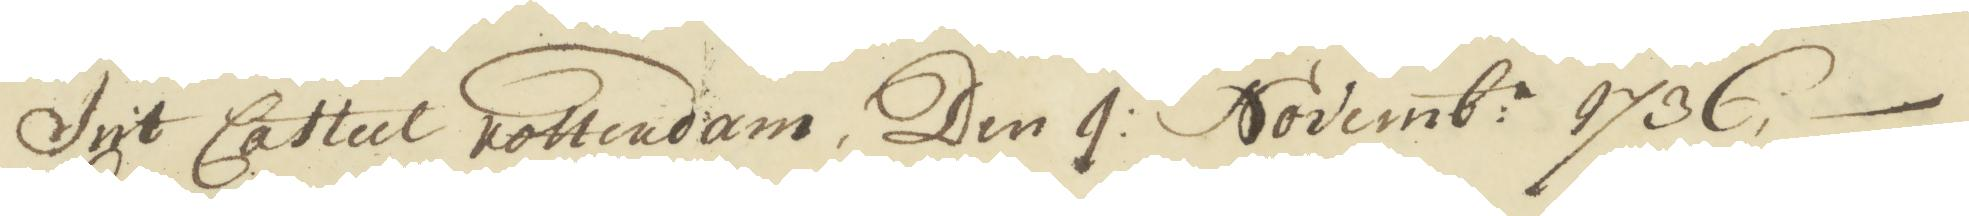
In't Casteel rotterdam, Den 4:' Novemb:r 1736; —
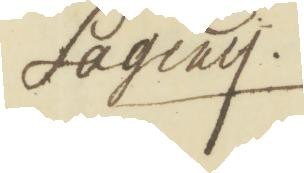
sagerij.
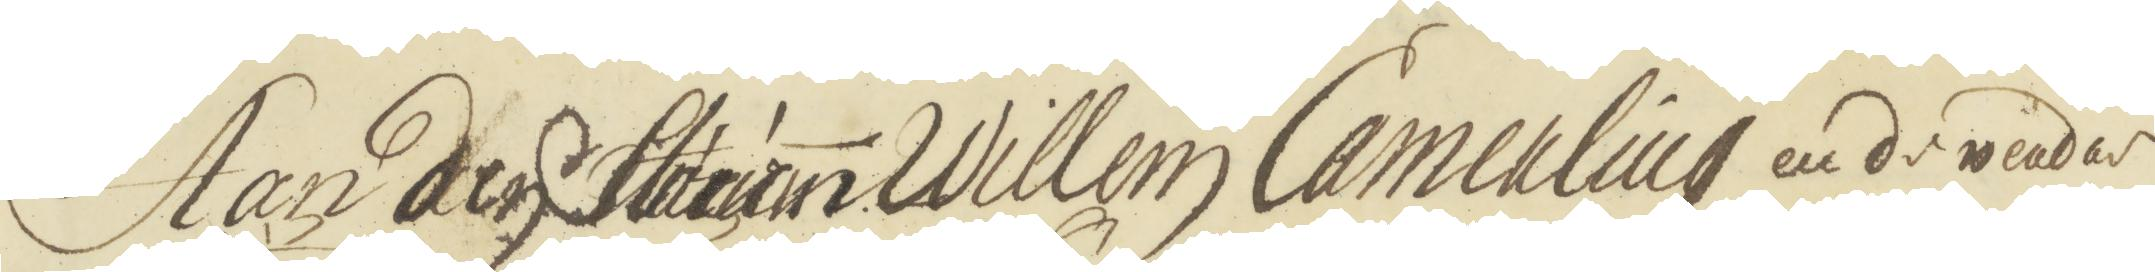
Aan den Stuurm: Willem Camerling en de verdre
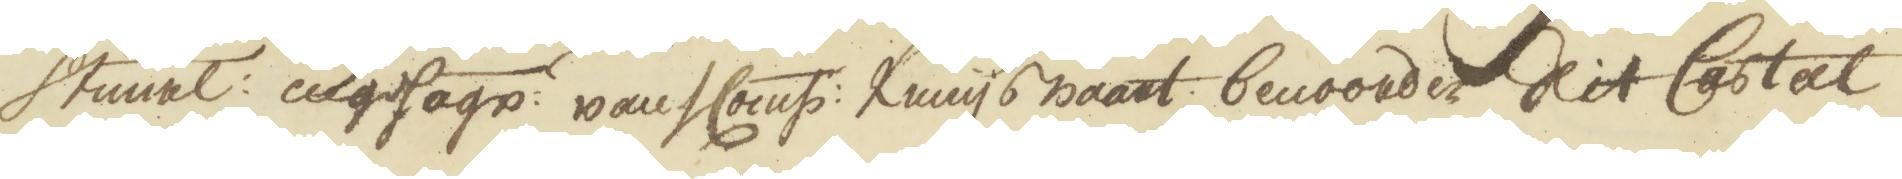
stuurl: engesagv: van sComp: kruijsvaart: benoorder dit Casteel
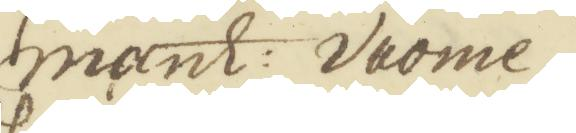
manh: Vrome.
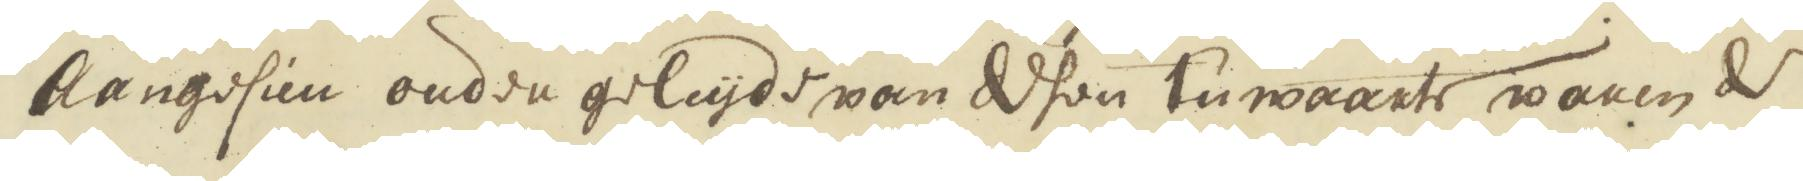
Aangesien onder geleijde van desen tuwaarts waren de
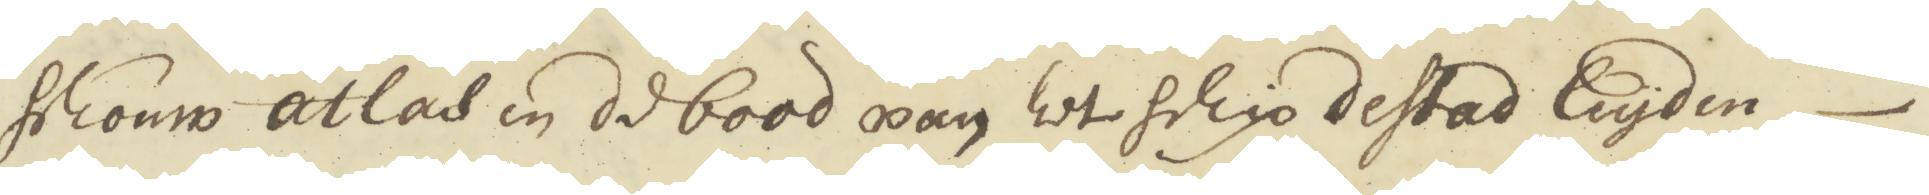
schouw atlas en de bood van het schip destad leijden —
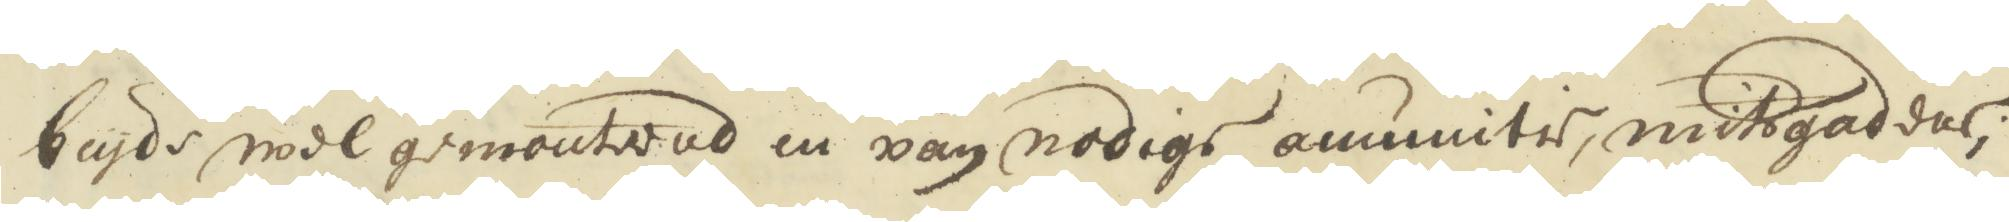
beijde wel gemonteerd en van nodige amunitie, mitsgaders;
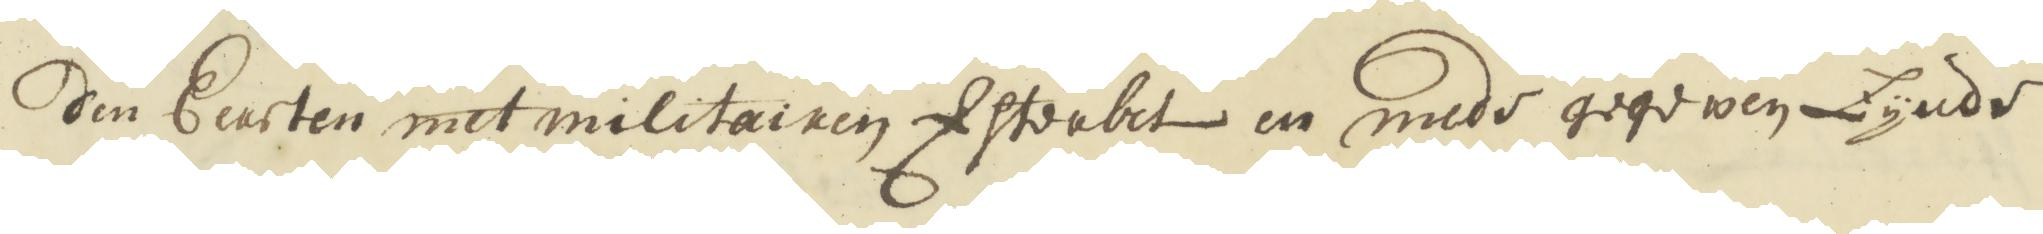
den Eersten met militairen versterkt en mede gegeven zijnde
